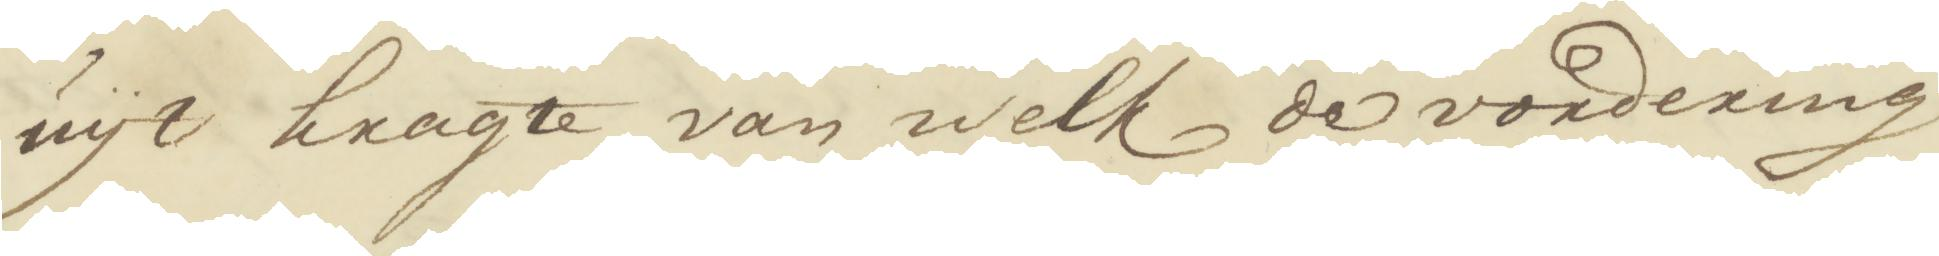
uijt kragte van welk de vordering
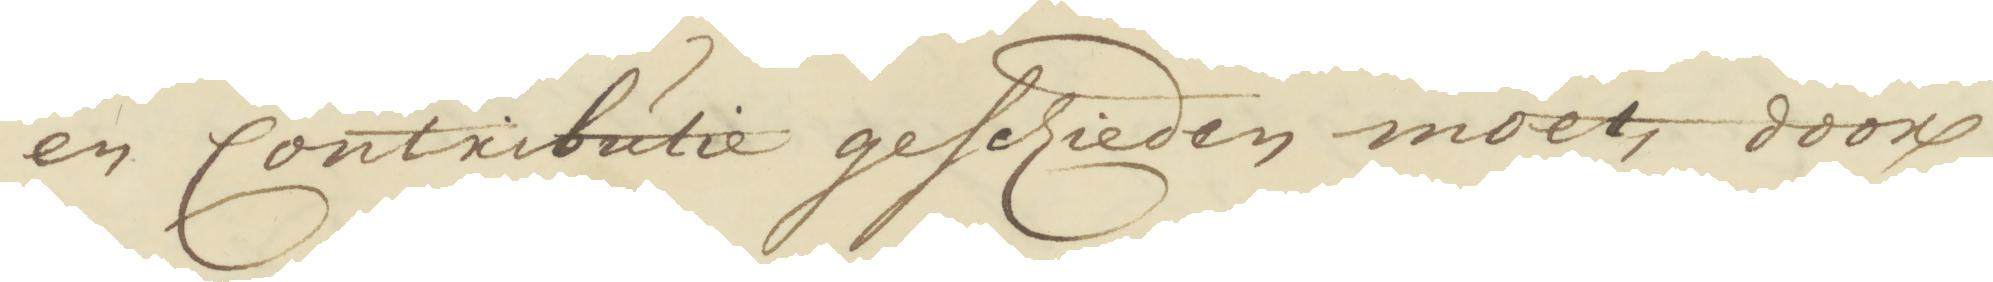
en Contributie geschieden moet, door
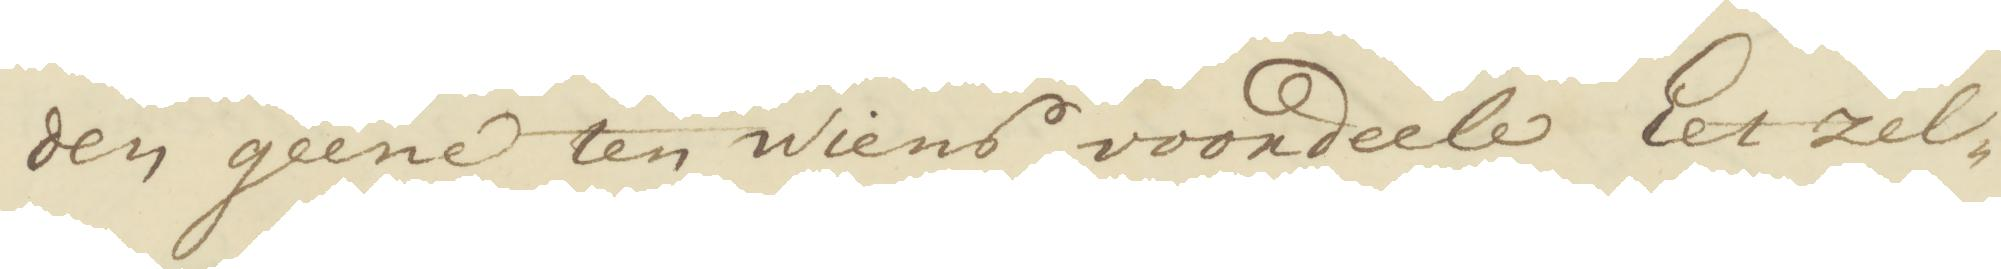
den geene ten wiens voordeele het zel„
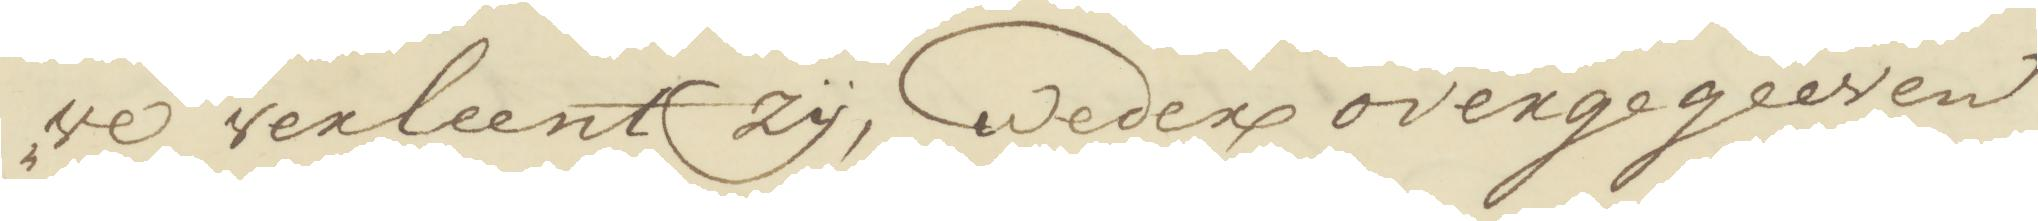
„ve verleent zij, weder overgegeeven
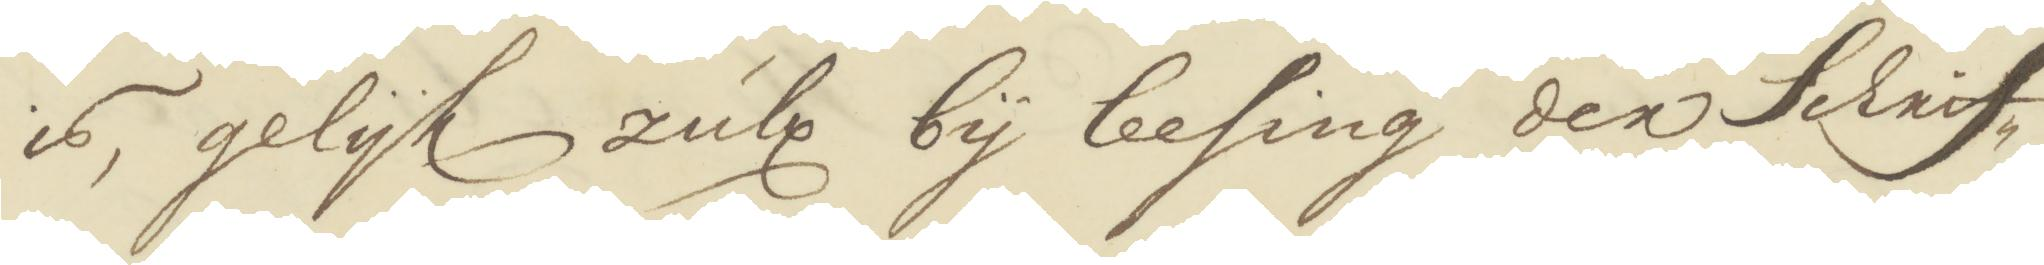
is, gelijk zulx bij leesing der schrif„
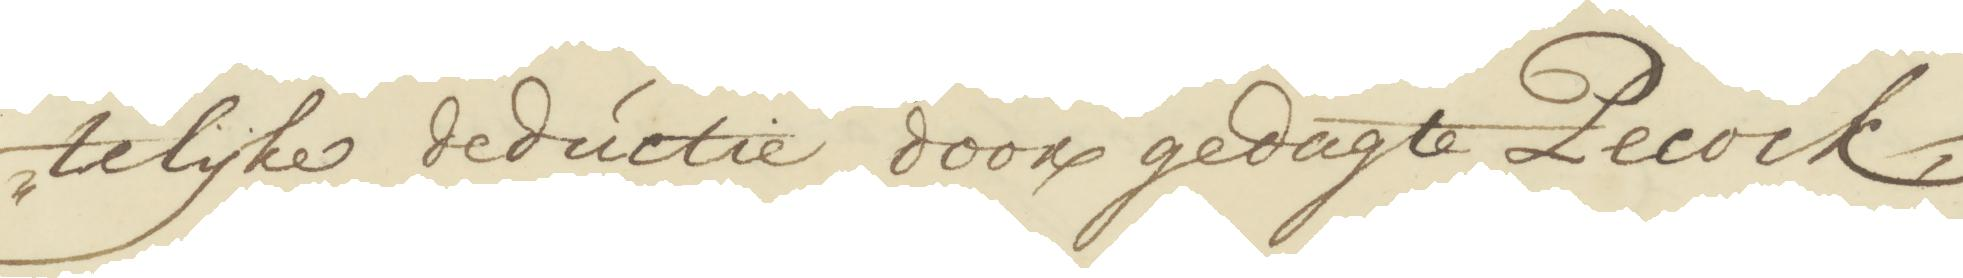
„telijke deductie door gedagte Pecock,
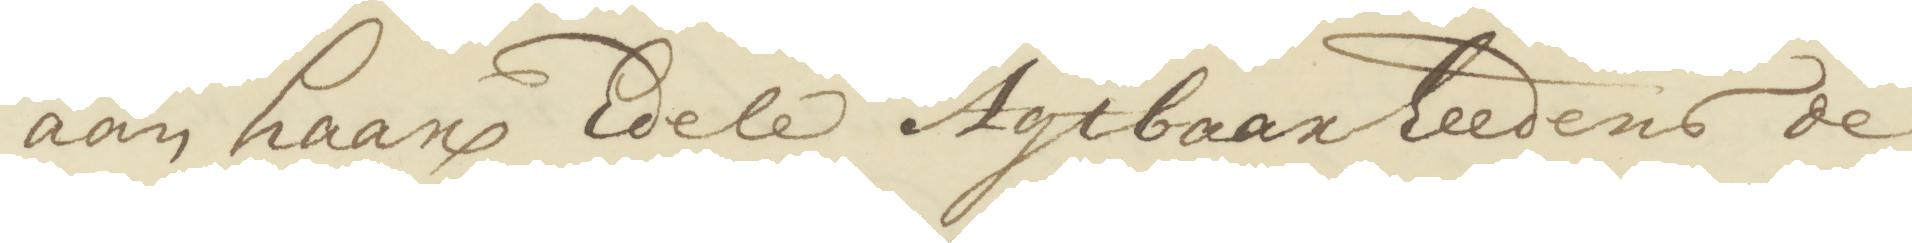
aan haar Edele Agtbaarheedens de
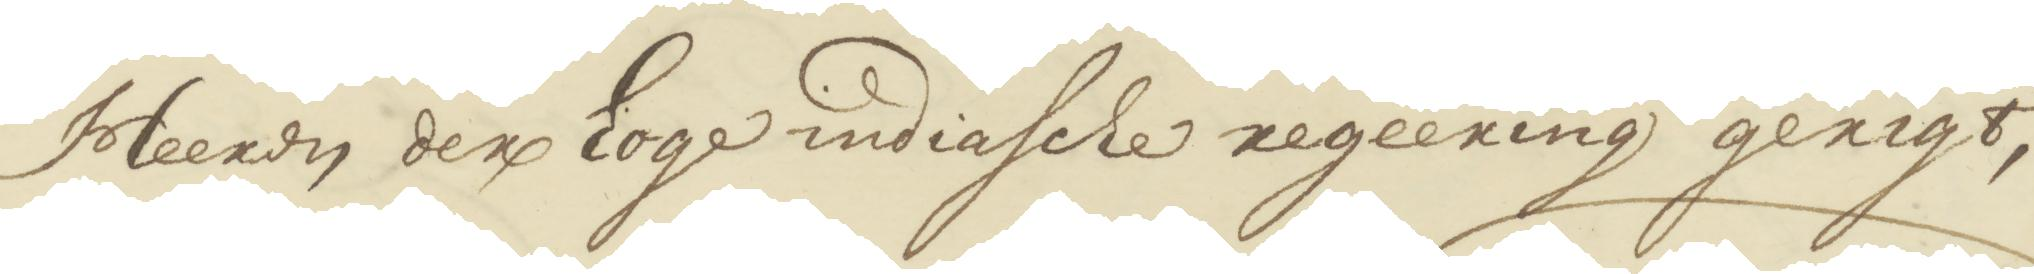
Heeren der hoge indiasche regeering gerigt,
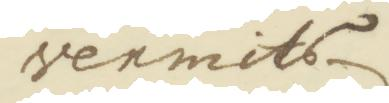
vermits—
